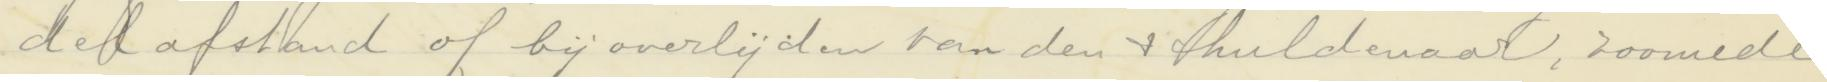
del afstand of bij overlijden van den schuldenaar, zoomede
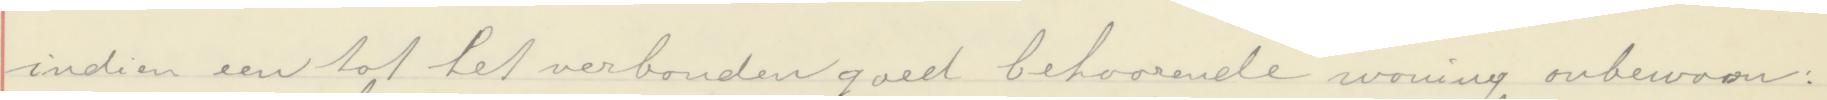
indien een tot het verbonden goed behoorende woning onbewoon:
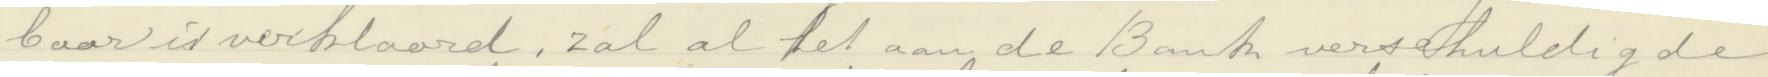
baar is verklaard, zal al het aan de Bank verschuldigde
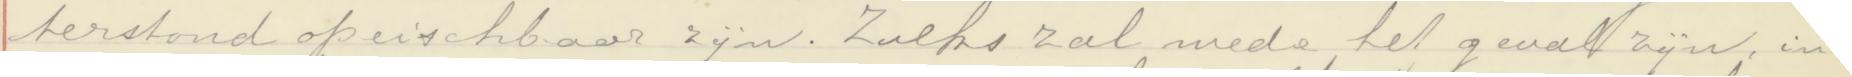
terstond opeischbaar zijn. Zulks zal mede het geval zijn, in
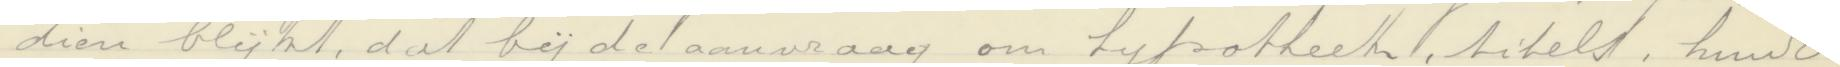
dien blijkt, dat bij de aanvraag om hypotheek, titels, huur
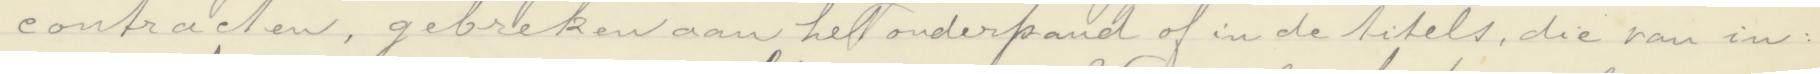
contracten, gebreken aan het onderpand of in de titels, die van in:
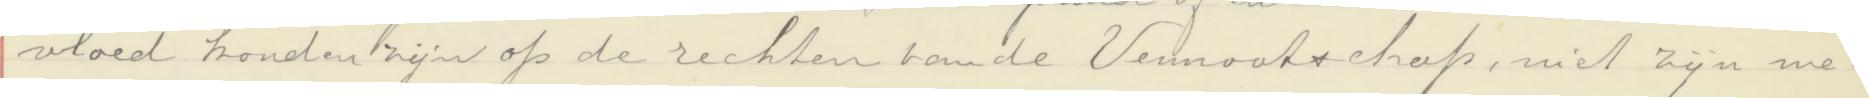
vloed houden zijn op de rechten van de Vennootschap, niet zijn me:
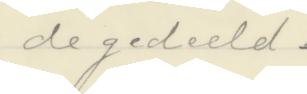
de gedeeld.
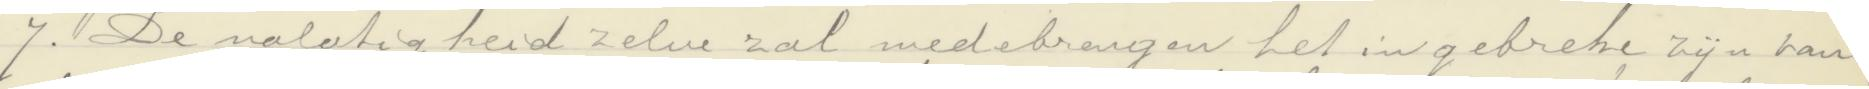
7. De nalatigheid zelve zal medebrengen het in gebreke zijn van
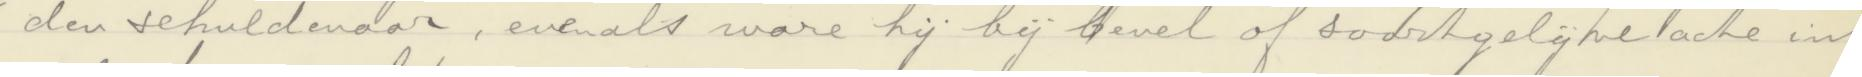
den schuldenaar, evenals ware hij bij bevel of soortgelijke acte in
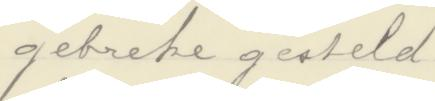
gebreke gesteld
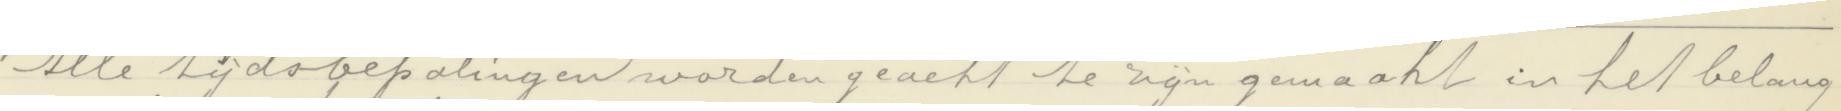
Alle tijdsbepalingen worden geacht te zijn gemaakt in het belang
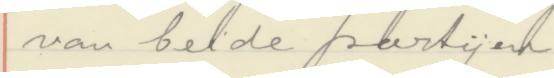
van beide partijen
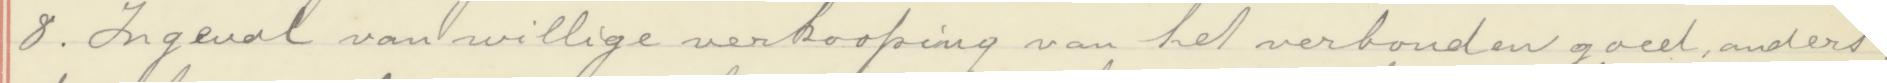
8. Ingeval van willige verkooping van het verbonden goed, anders
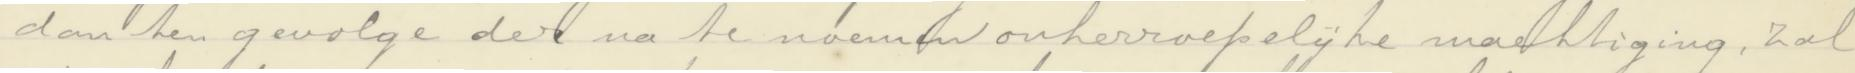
dan ten gevolge der na te noemen onherroepelijke machtiging, zal
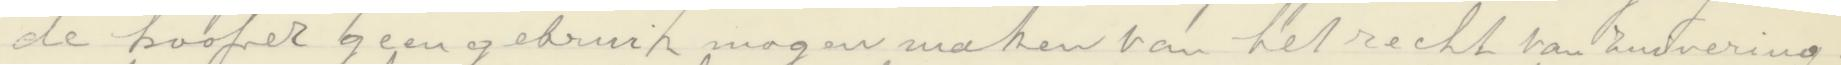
de kooper geen gebruik mogen maken van het recht van movering
